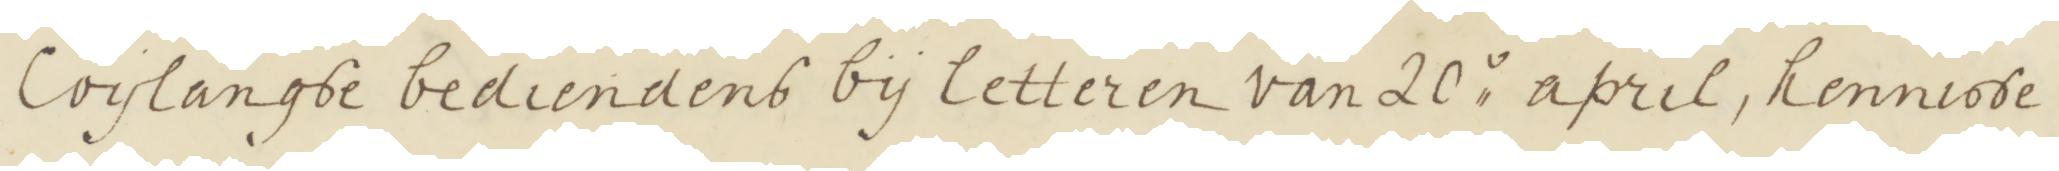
Coijlangse bediendens bij letteren van 20„' april, kennisse
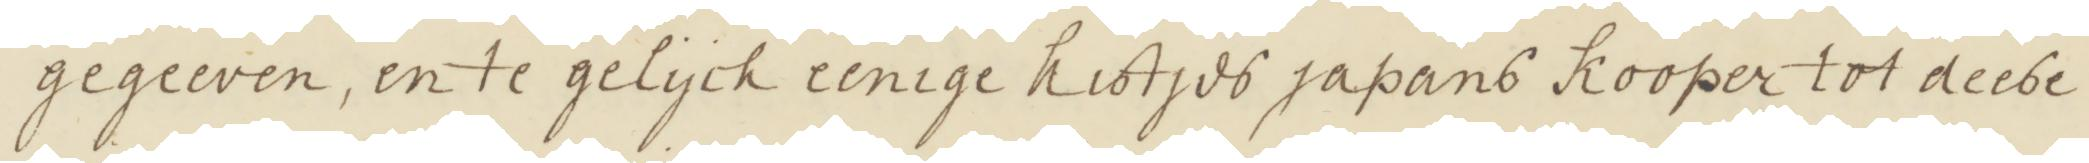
gegeeven, en te gelijck eenige kistjes japans kooper tot deese
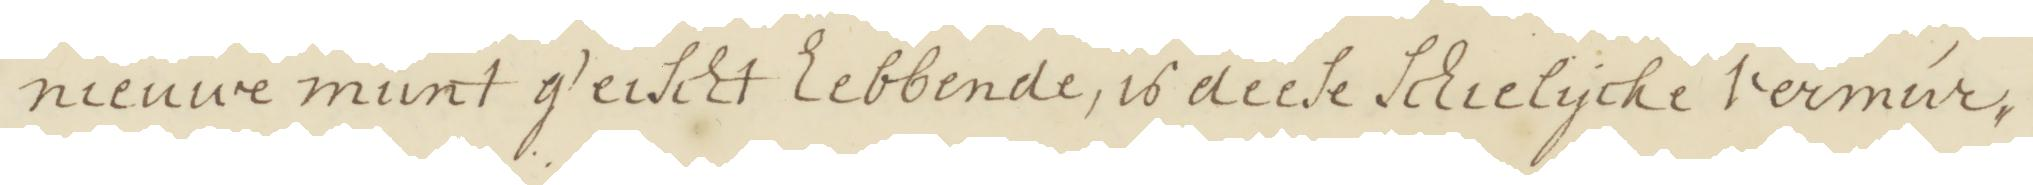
nieuwe munt g’eischt hebbende, is deese schielijcke vermur„
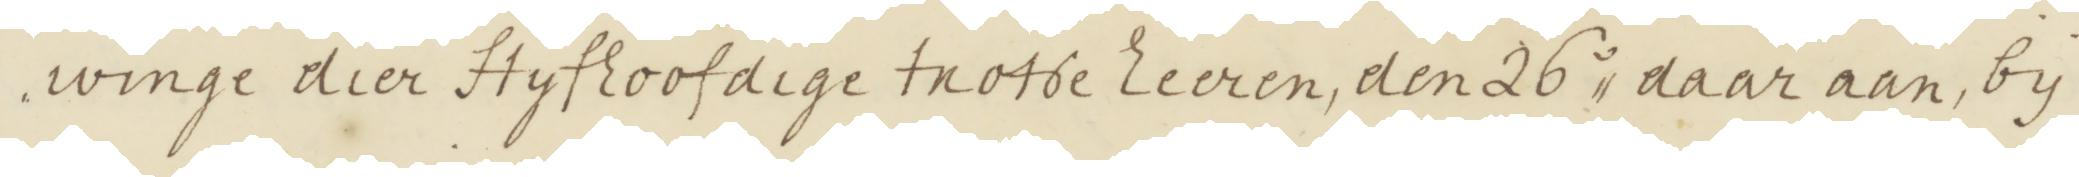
„winge dier stijfhoofdige trotse heeren, den 26„' daar aan, bij
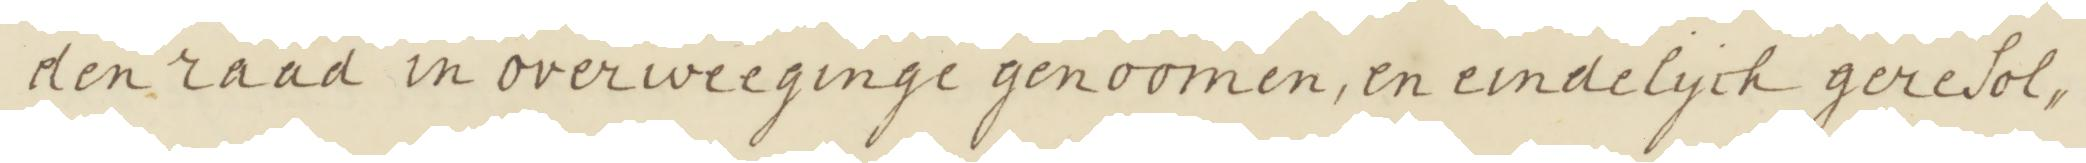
den raad in overweeginge genoomen, en eindelijck geresol„
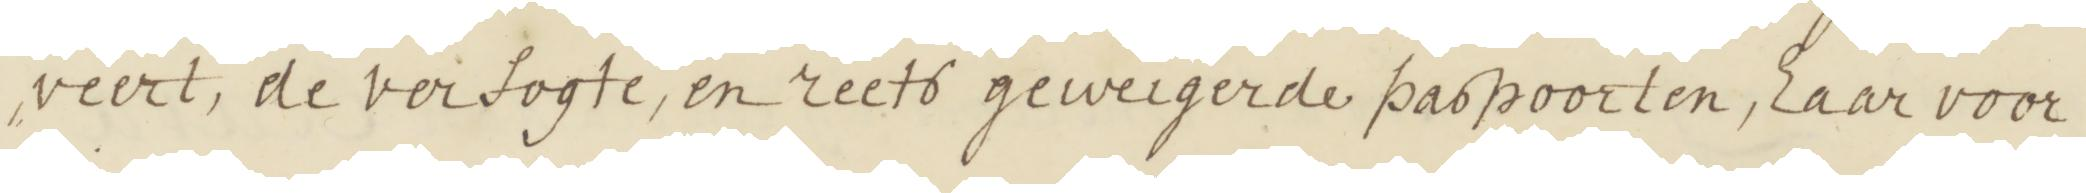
„veert, de versogte, en reets geweigerde paspoorten, haar voor
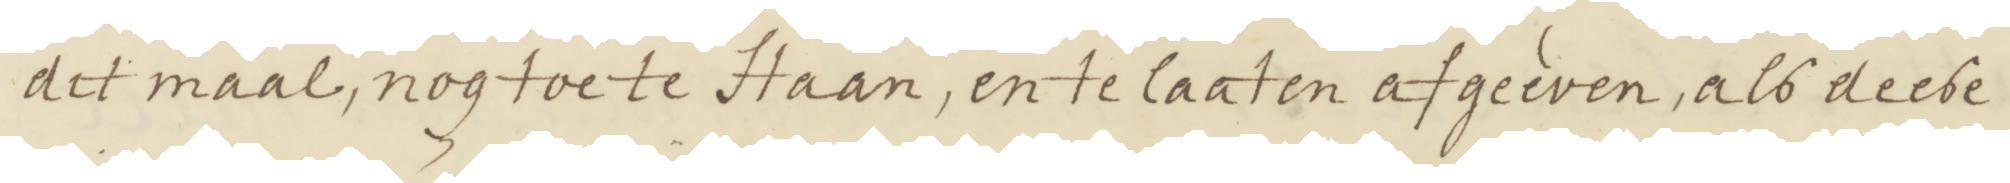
dit maal, nog toe te staan, en te laaten afgeeven, als deese
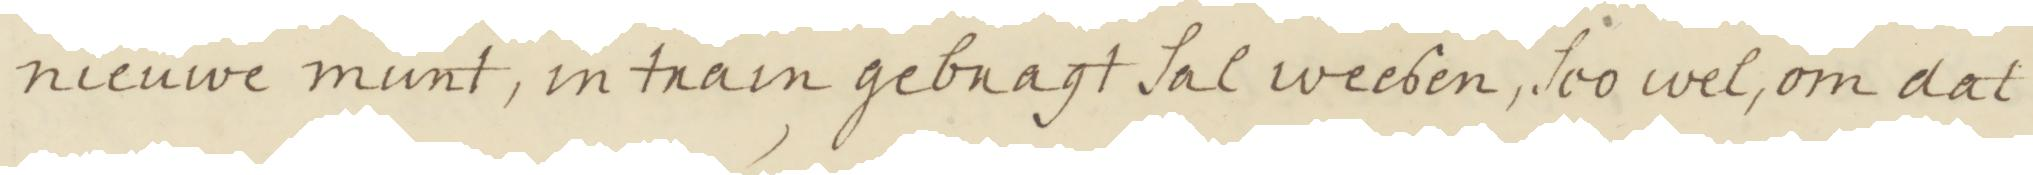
nieuwe munt, in train gebragt sal weesen, soo wel, om dat
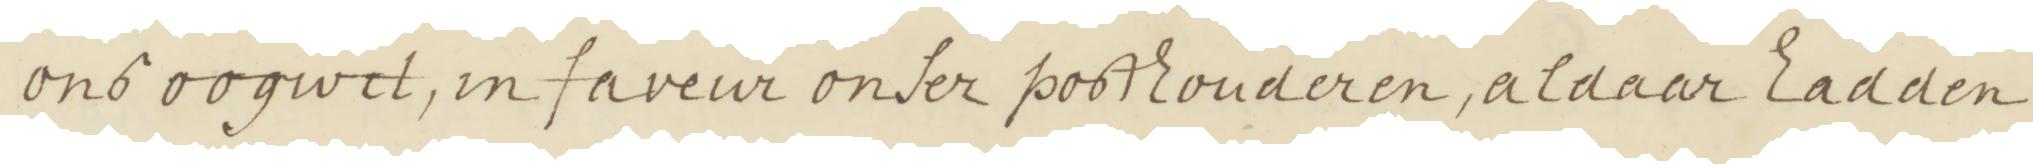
ons oogwit, in faveur onser posthouderen, aldaar hadden
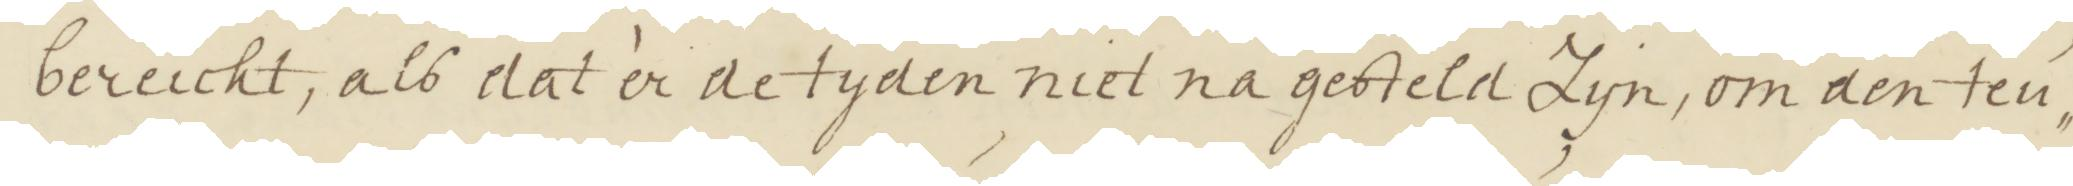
bereickt, als dat 'er de tijden niet na gesteld zijn, om den teu
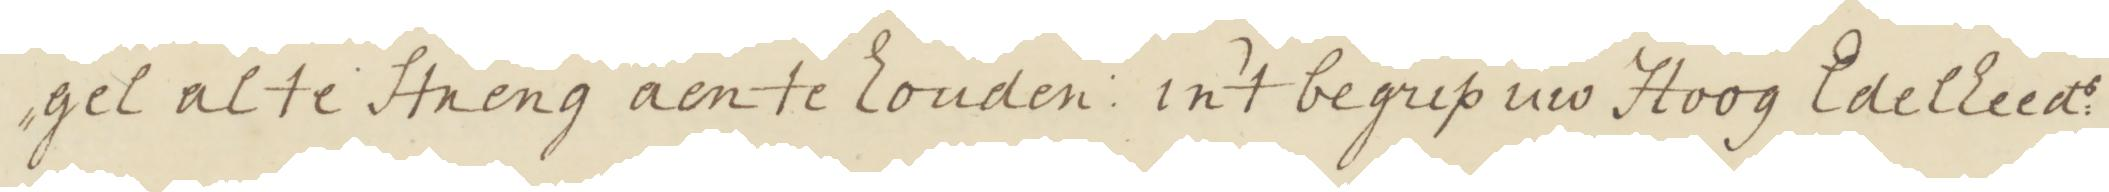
„gel al te streng aen te houden: in ’t begrip uw Hoog Edelheed:s
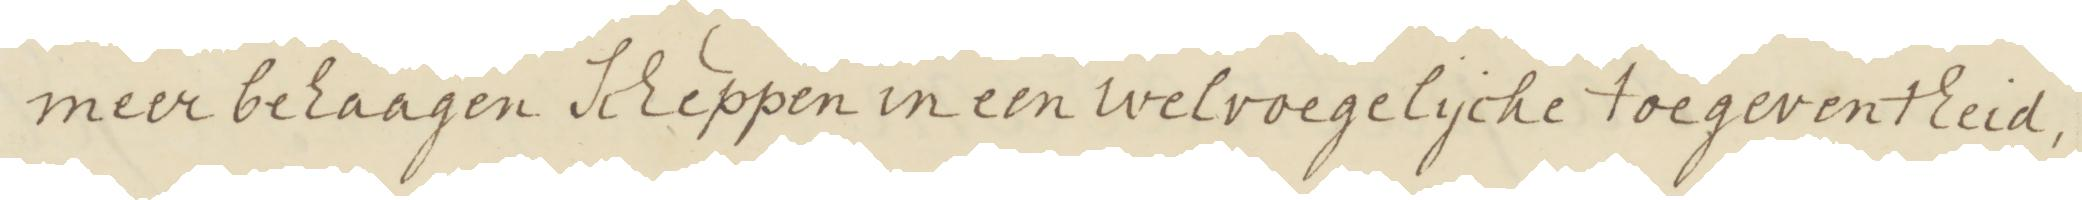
meer behaagen scheppen in een welvoegelijcke toegeventheid,
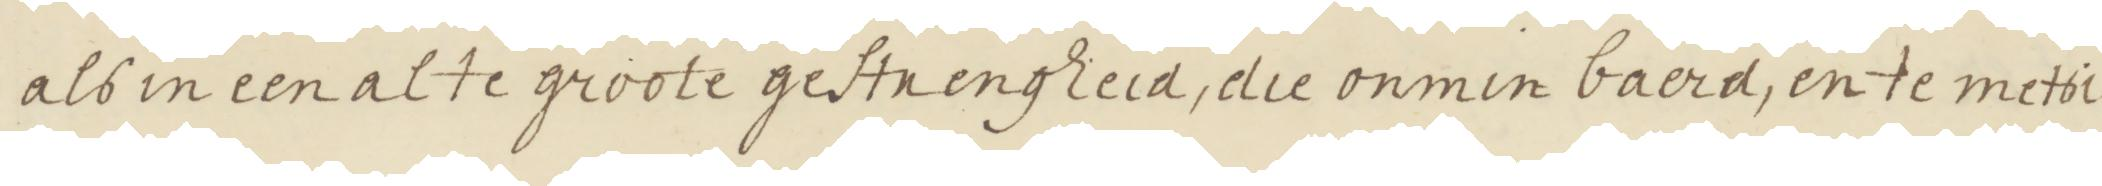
als in een al te groote gestrengheid, die onmin baerd, en te mets
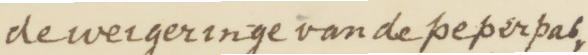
de weigeringe van de peperpas„
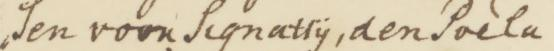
„sen voor signattij, den Poela
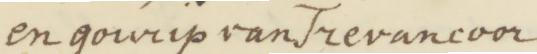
en gourip van Trevancoor
